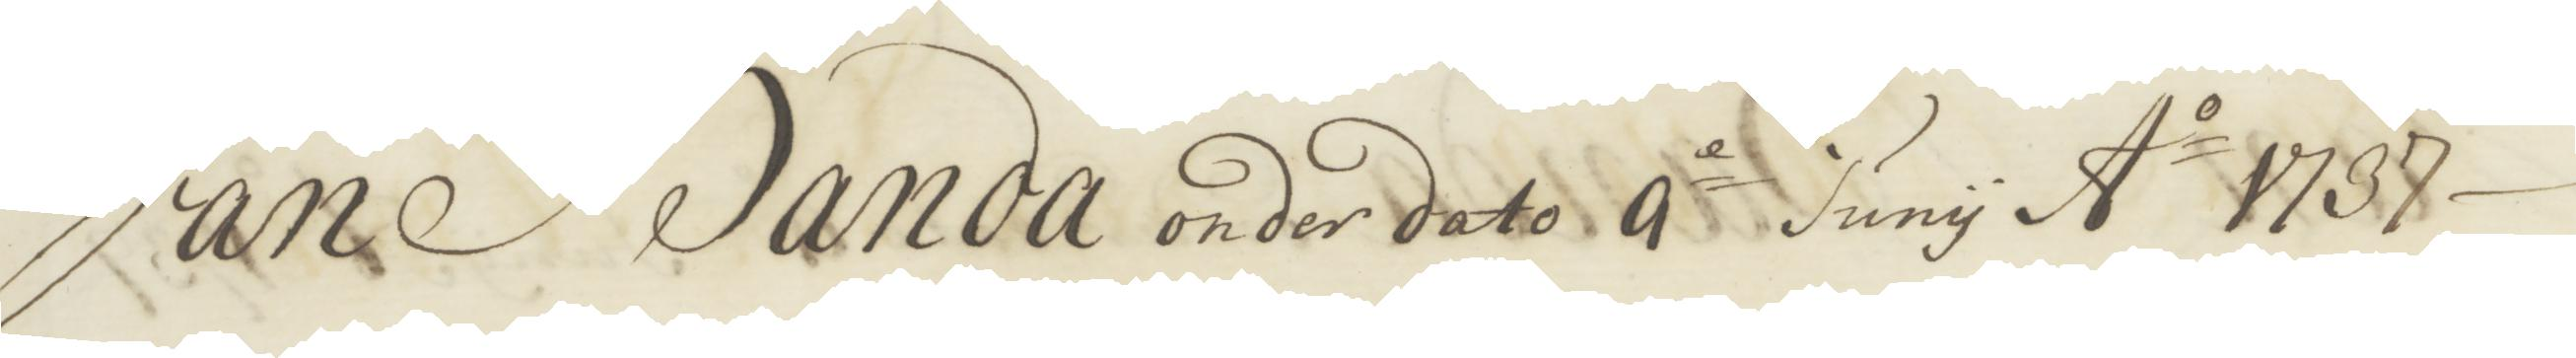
Van Banda onder dato 9=e Iunij A=o 1737—
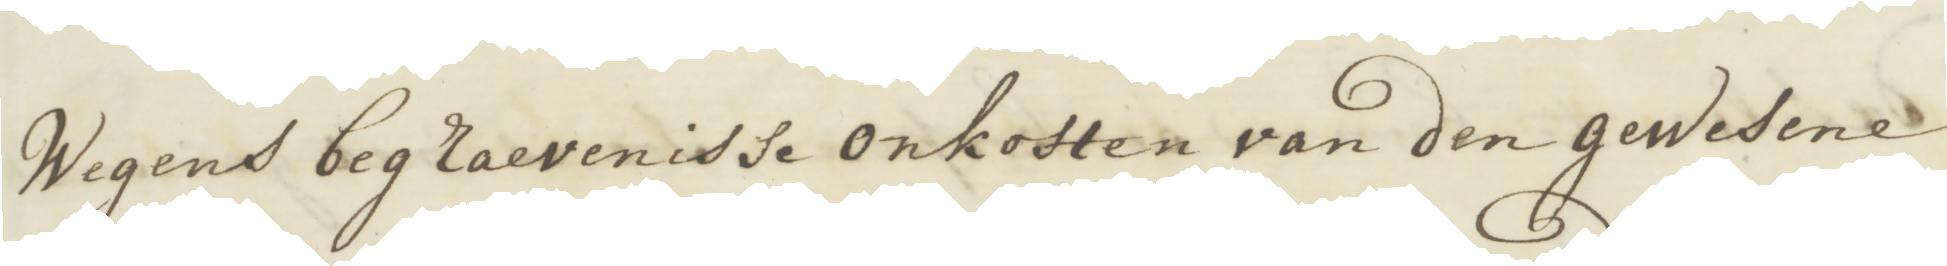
Wegens begraevenisse onkosten van den gewesene
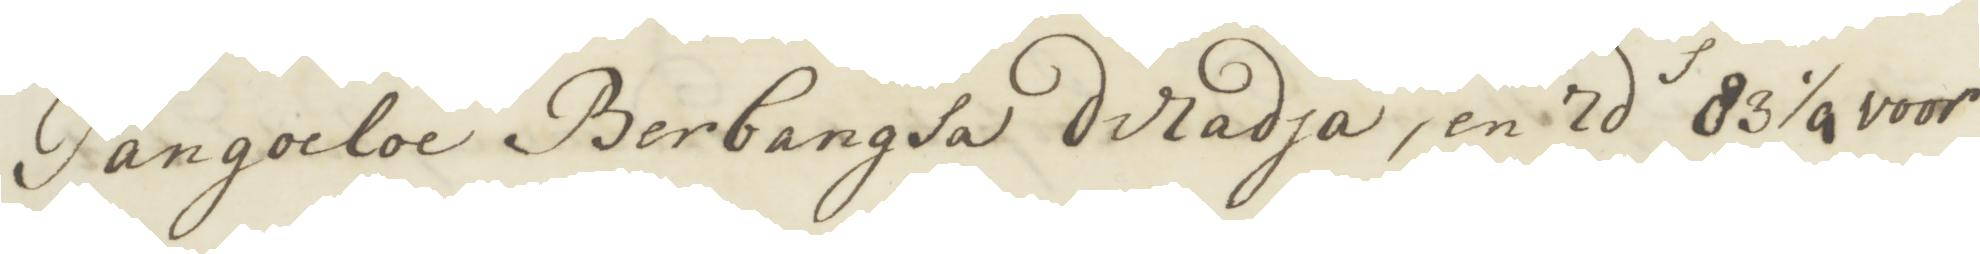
Pangoeloe Berbangsa diradja, en rds 83¼ voor
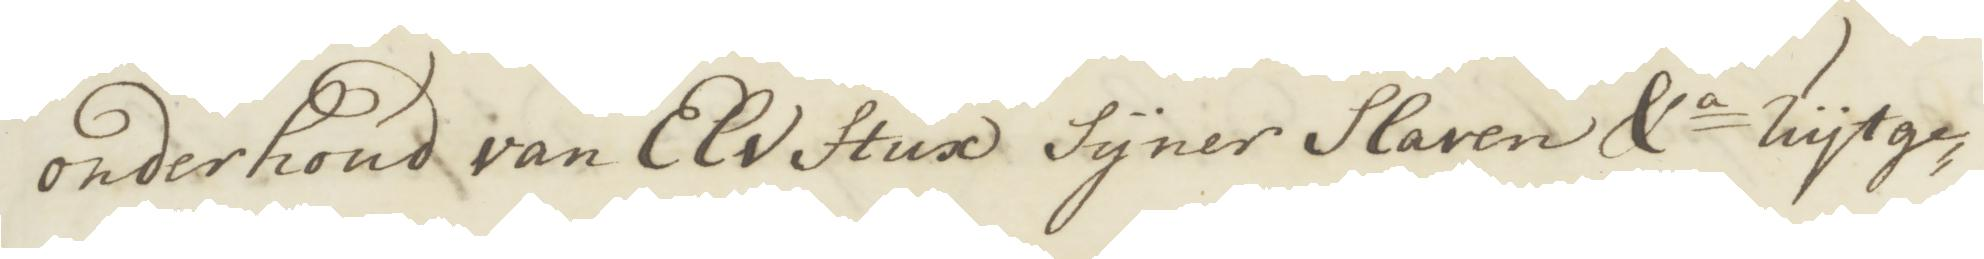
onderhoud van Elv stux sijner slaven &=a uijtge„
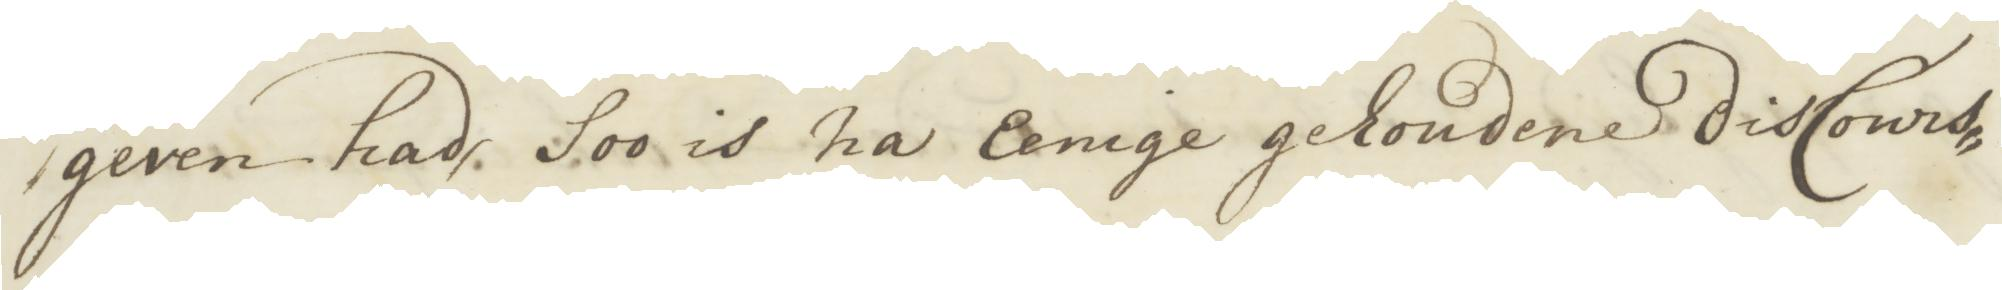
„geven had, soo is Na Eenige gehoudene discours„
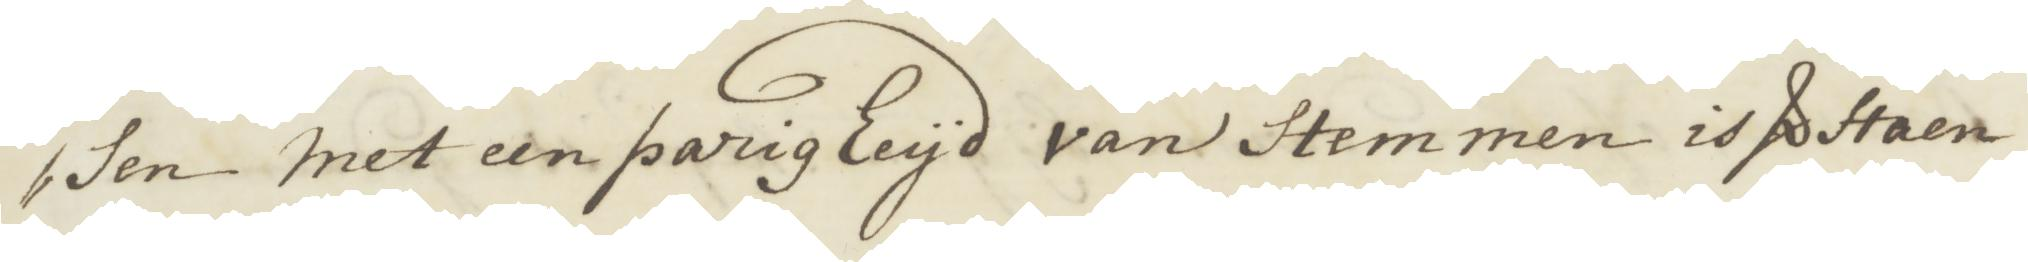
„sen met een parig heijd van stemmen is verstaen
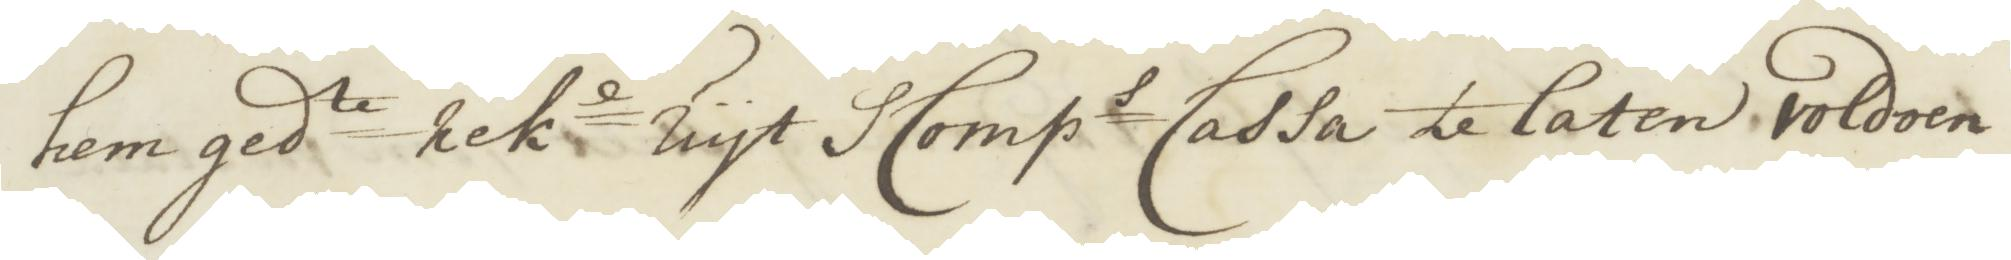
hem ged=te rek=e uijt sComp=s Cassa te laten voldoen
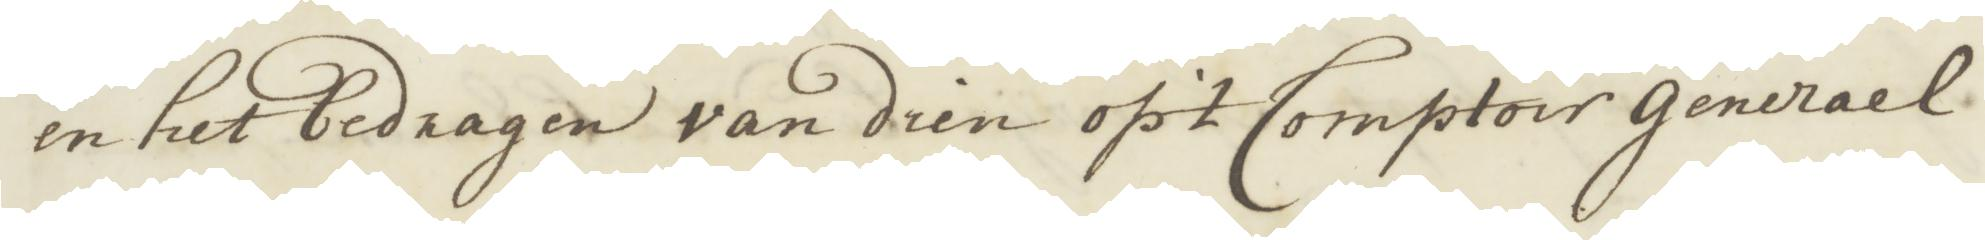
en het bedragen van dien op’t Comptoir generael
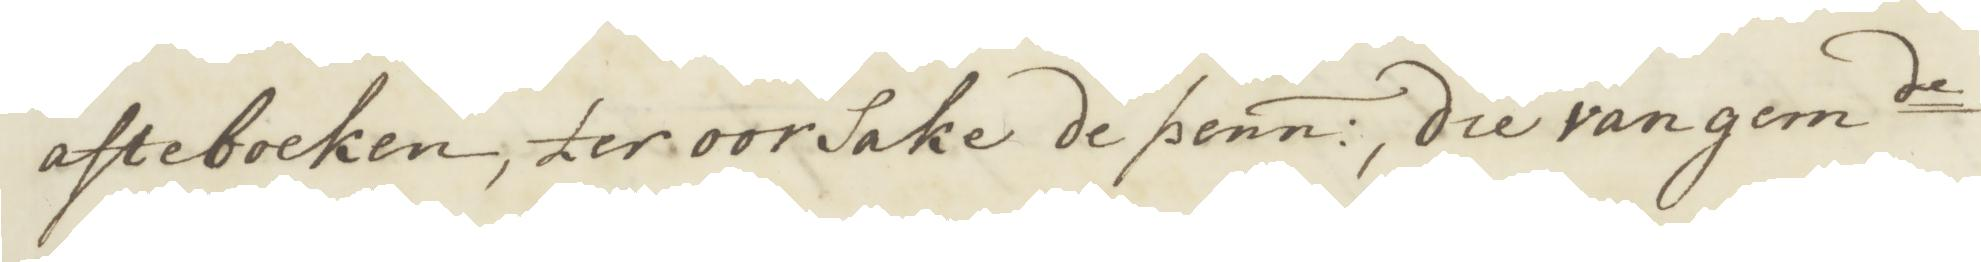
afteboeken, ter oorsake de penn:, die van gem=de
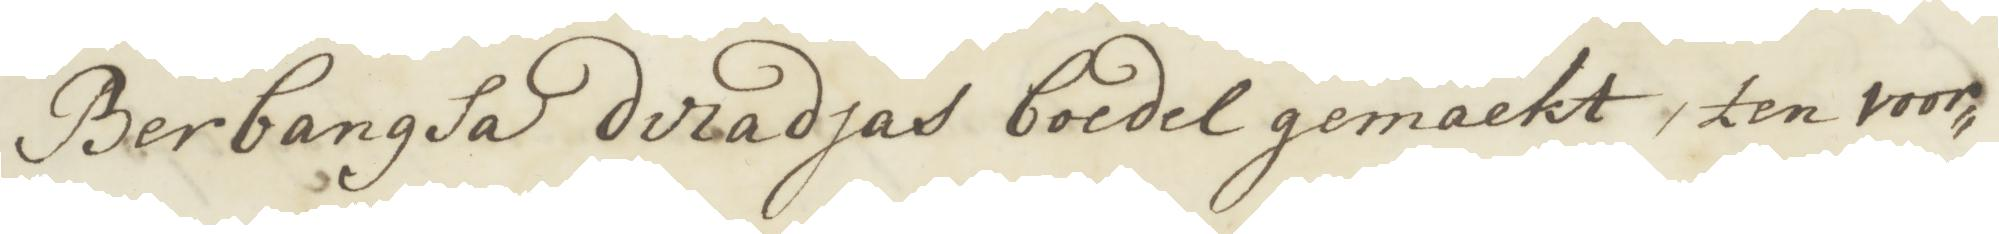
Berbangsa diradjas boedel gemaekt, ten voor„
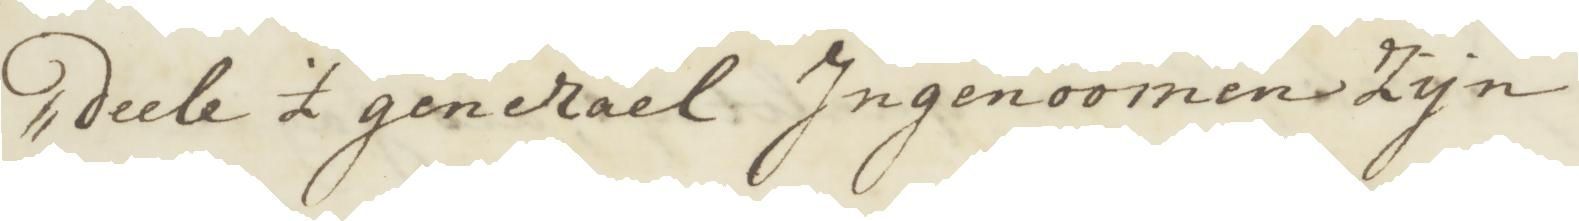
„deele ’t generael Jngenoomen zijn
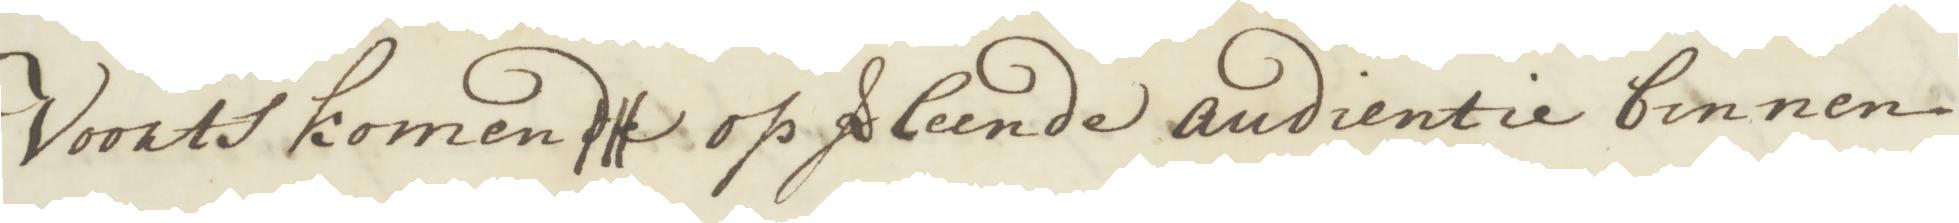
Voorts komende op verleende audientie binnen
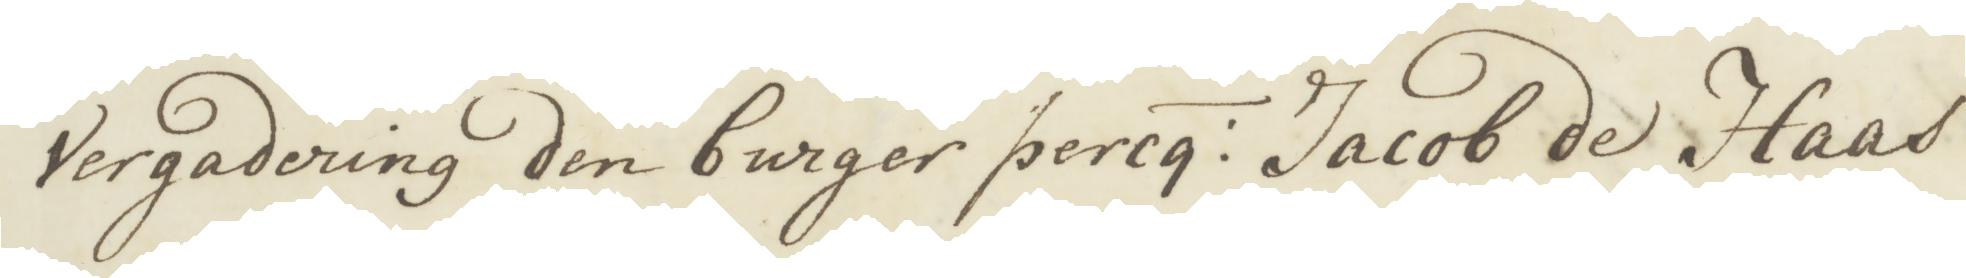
Vergadering den burger percq: Iacob de Haas
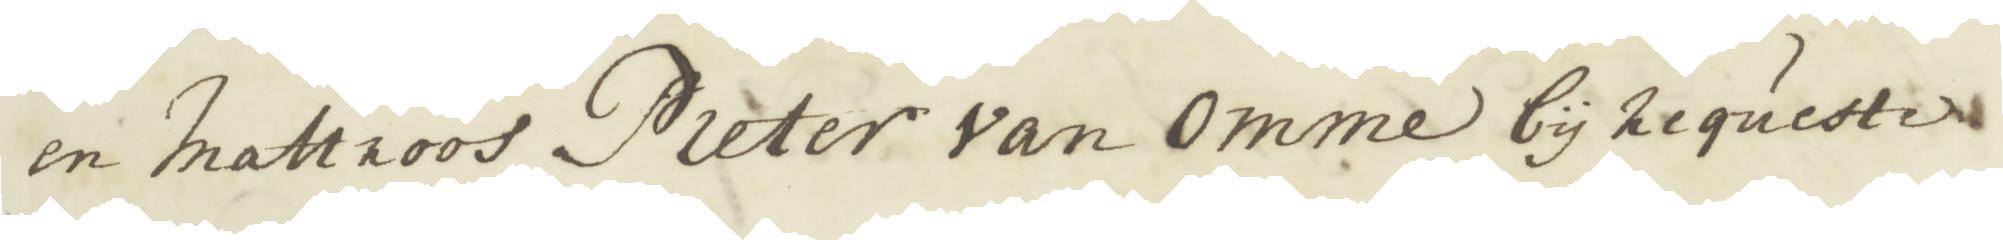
en Mattroos Pieter van Omme bij requeste
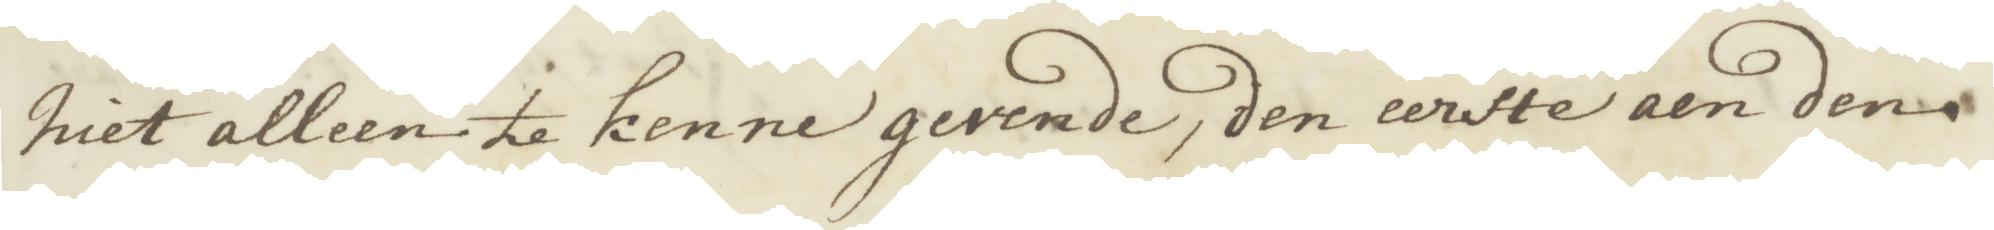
niet alleen te kenne gevende, den eerste aen den
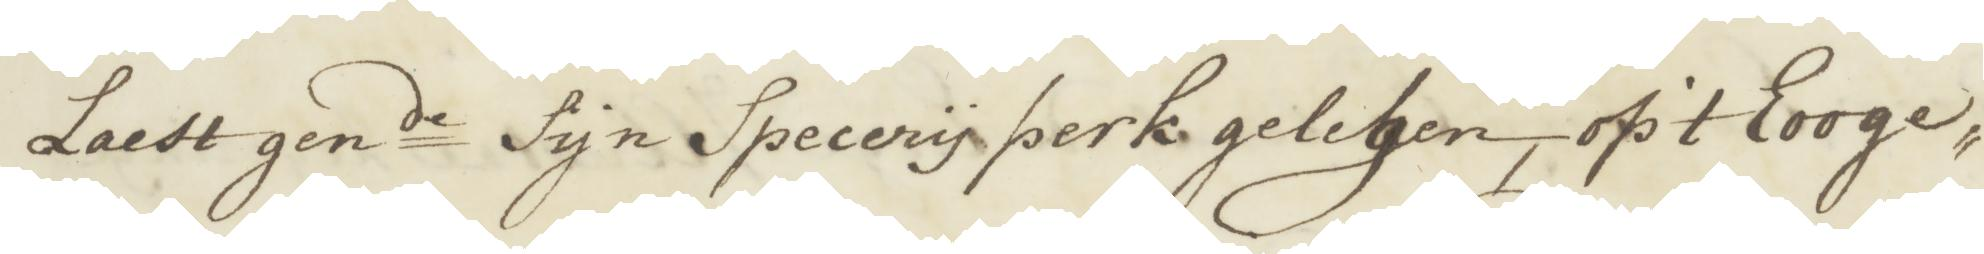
Laest gen=de sijn specerij perk gelegen, op ’t hooge„
